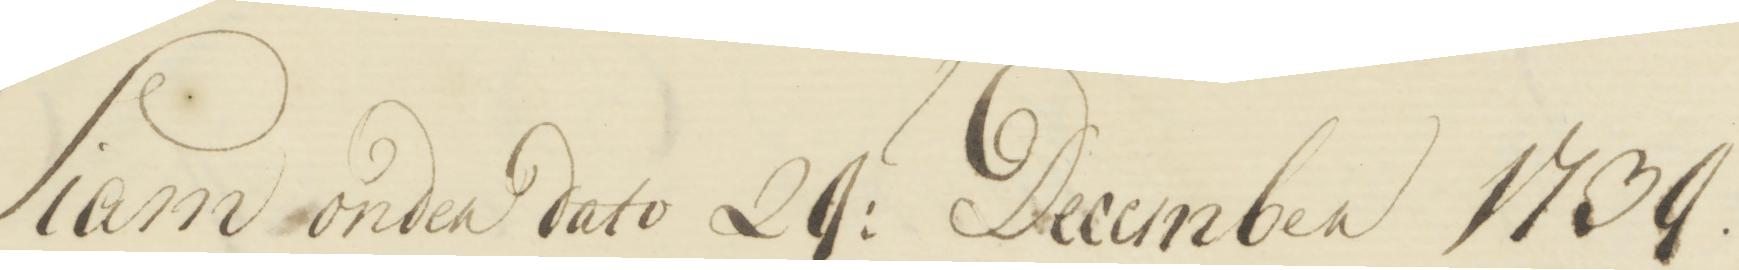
Van Siam onder dato 24:' December 1734.
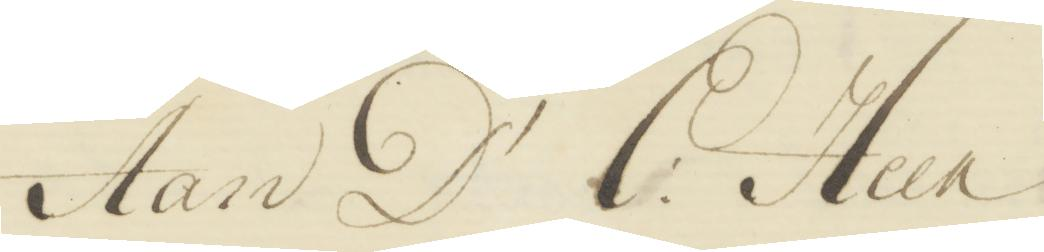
Aan D' E: Heer
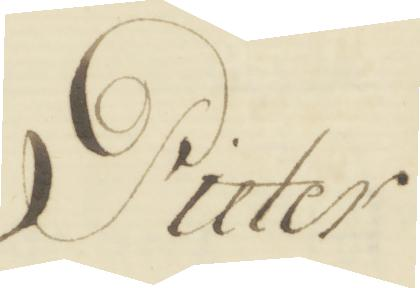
Pieter Sijen
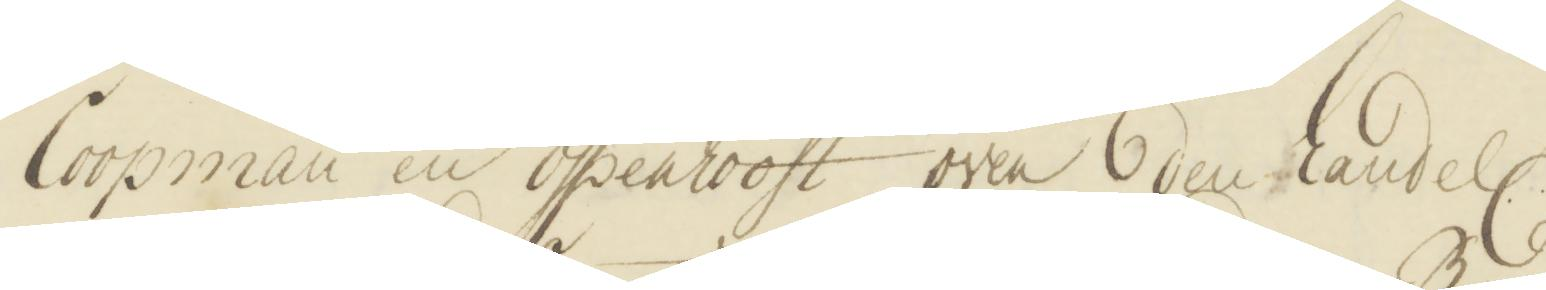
Coopman en opperhooft over den handel
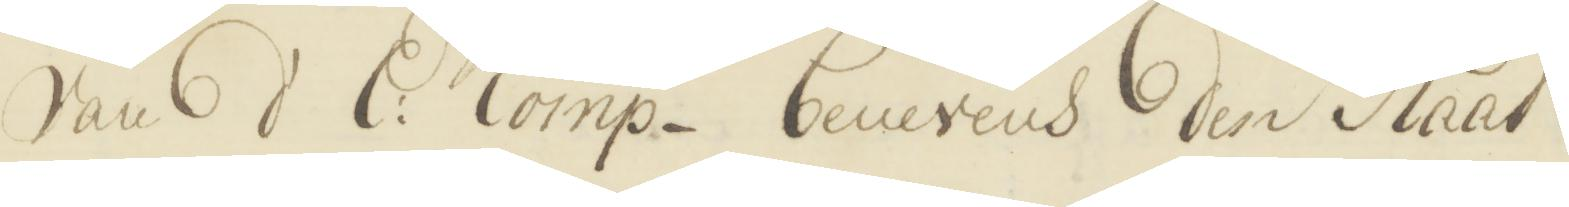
van d' E: Comp-e benevens den Raad
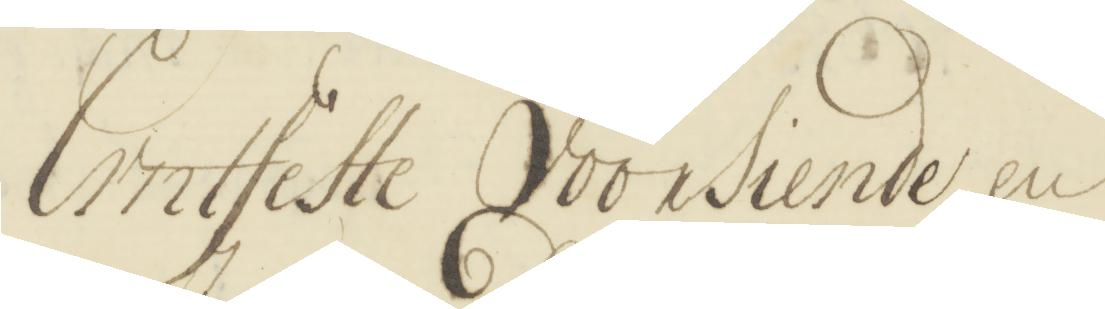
Erntfeste voorsiende, en
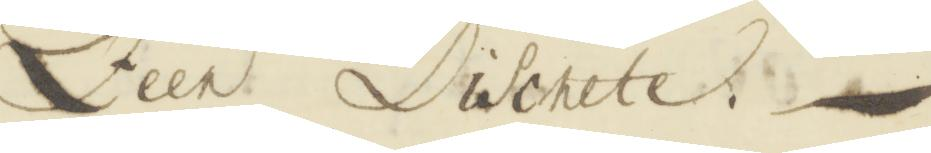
Zeer Discrete:
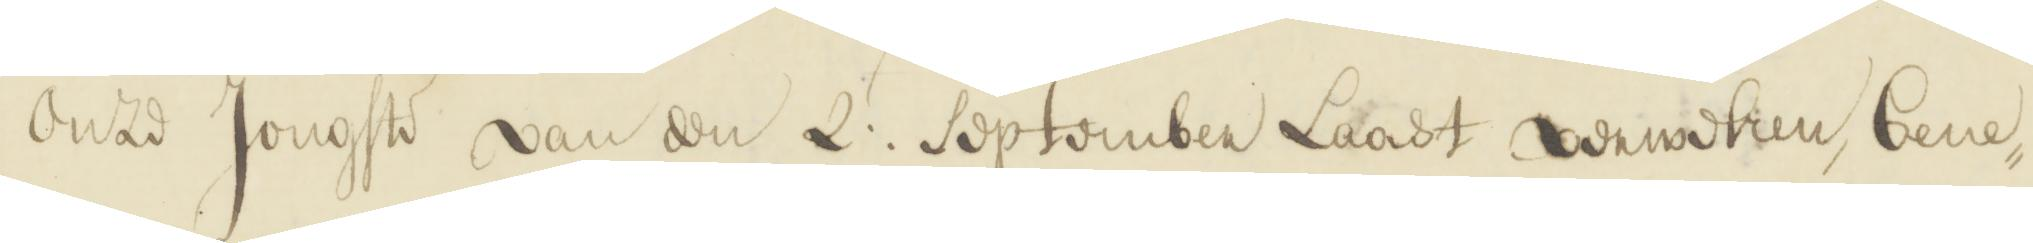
onze Jongste van den 2:' september laast verweken, bene„
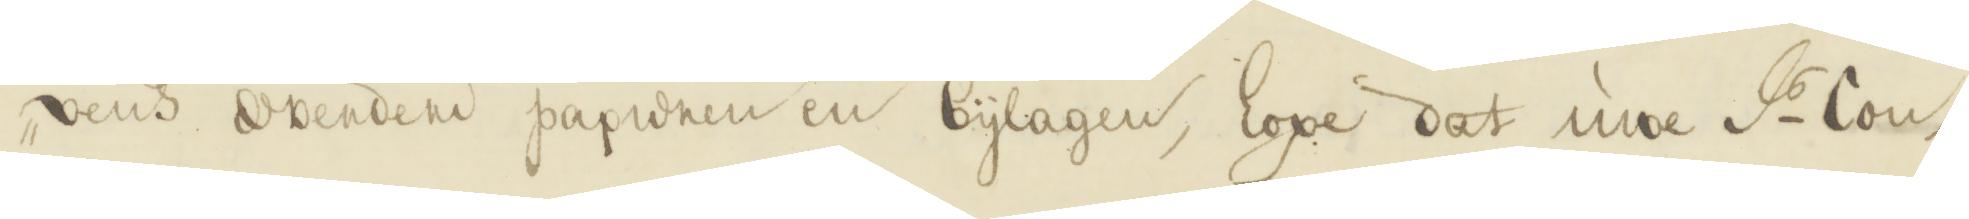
„vens de verdere papieren en bijlagen, hope dat uwe J-s Con„
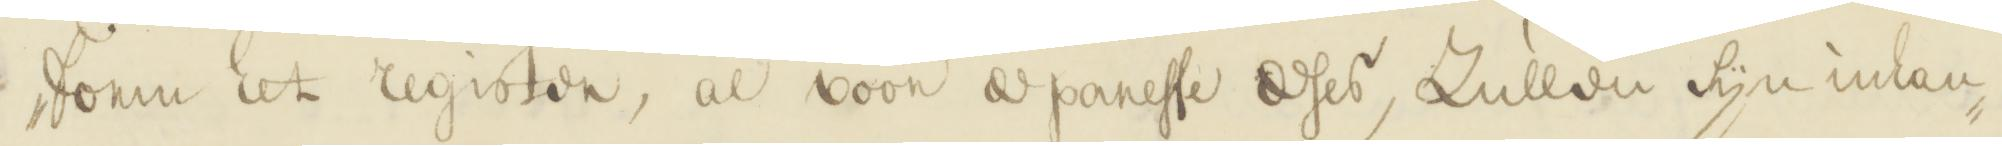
„form het register, al voor de paresse deses, zullen sijn inhan„
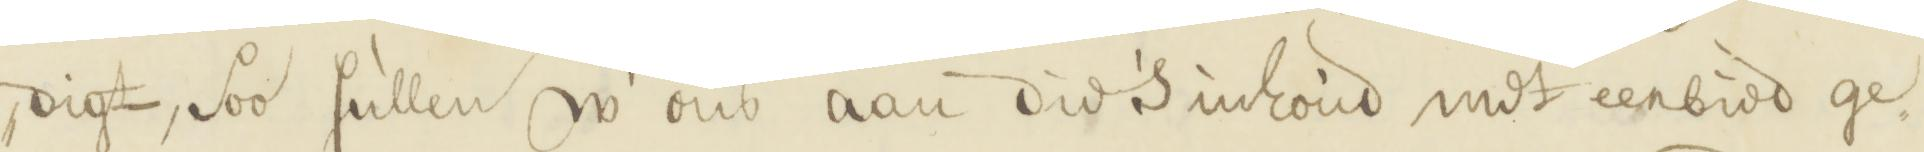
„digt, soo sullen w' ons aan die's inhoud met eerbied ge„
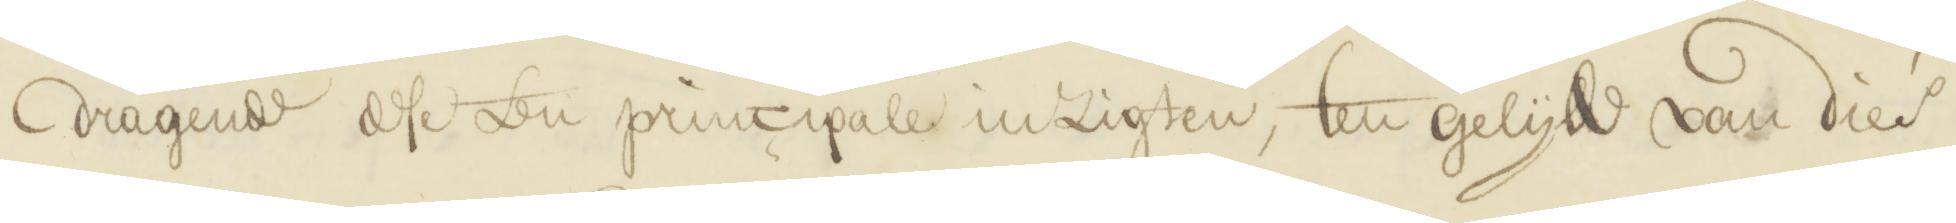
dragende dese ten principale inzigten, ten gelijde van die's
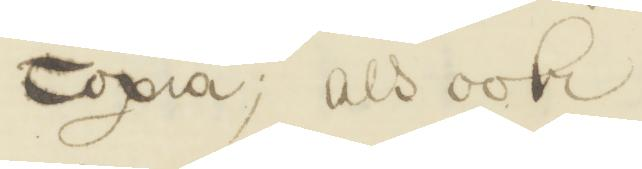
copia; als ook
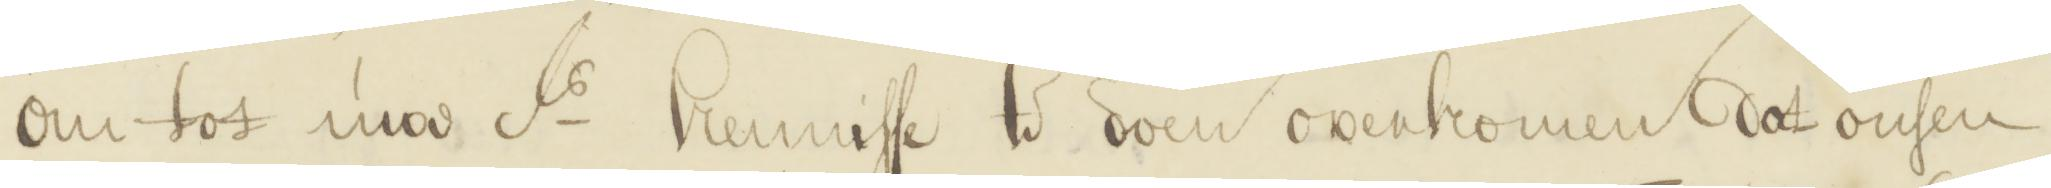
om tot uwe J-s kennisse te doen overkomen dat onsen
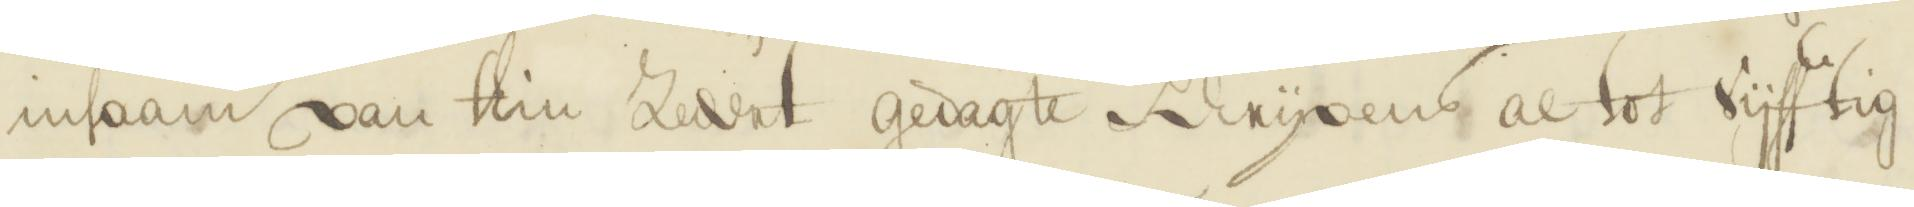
insaam van thin zedert gedagte schrijvens al tot vijfftig
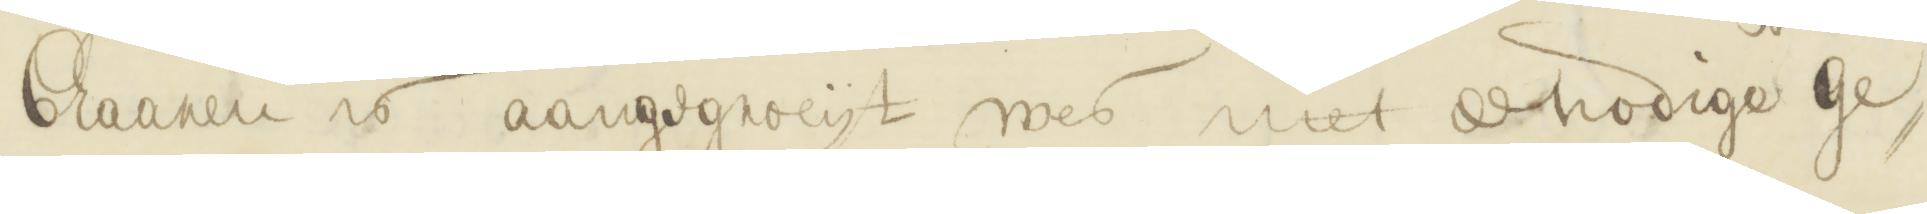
bhaaren is aangegroeijt wes met de nodige ge„
